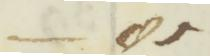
- 85
